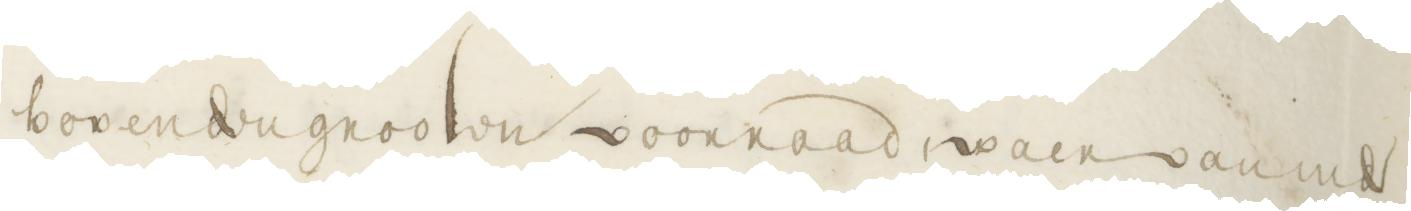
boven den grooten voorraad, waer van inde
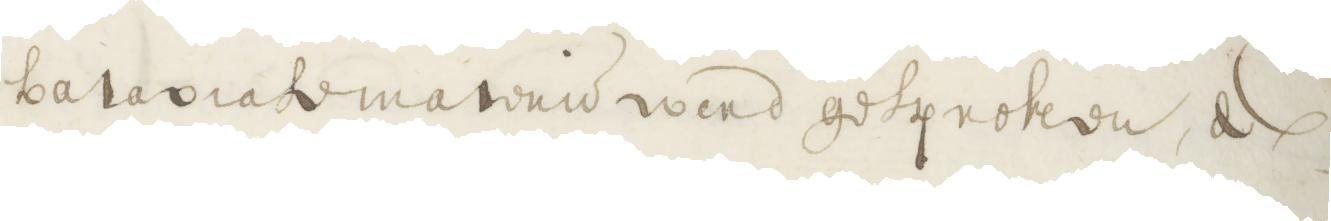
bataviase materie werd gesproken, de
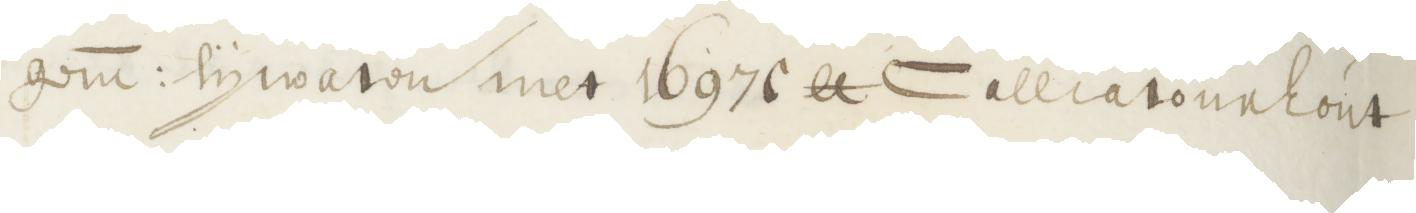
gem: lijwaten met 16975 lb Calliatourhout
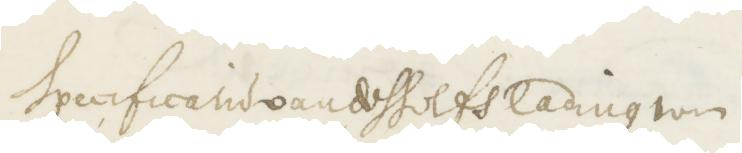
specificatie van desselfs lading ten
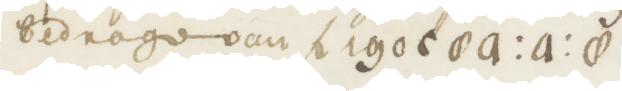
bedrage van ƒ190584:4:8
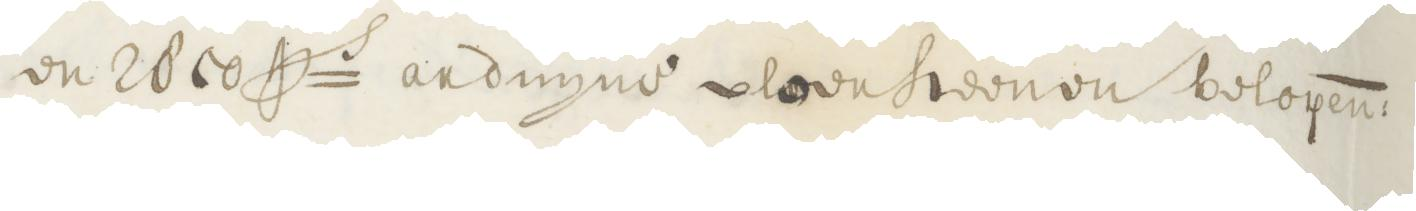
en 2850 P=s arduijne vloersteenen belopen:
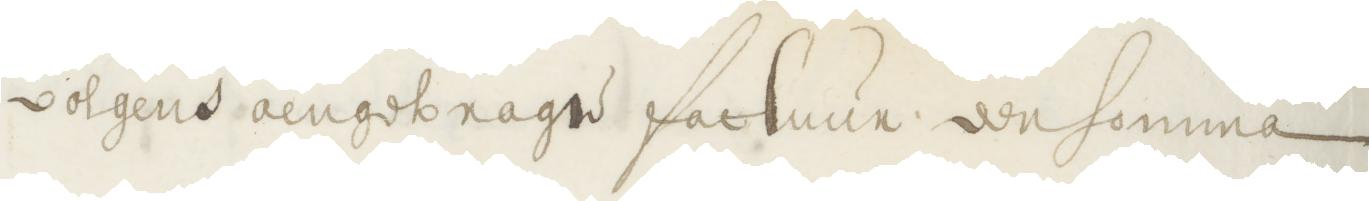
volgens aengebragte factuur een somma
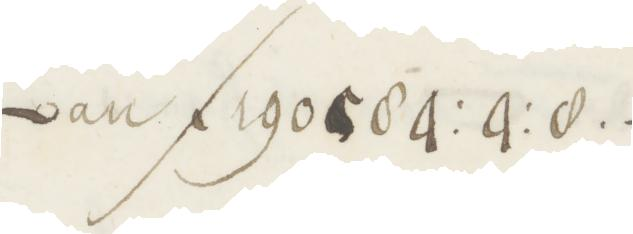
van ƒ190584:4:8.
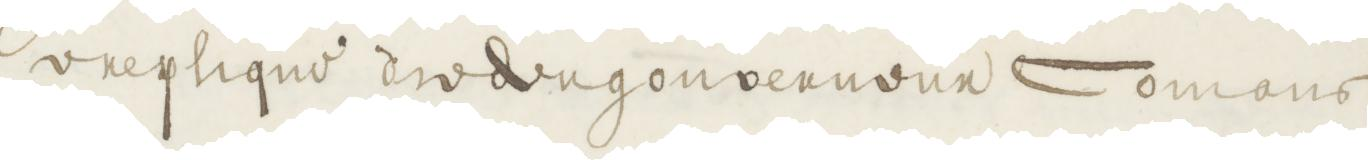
de replique die den gouverneur Comans
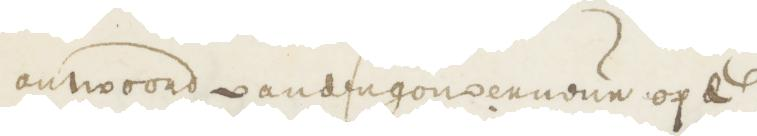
antwoord van den gouverneur op de
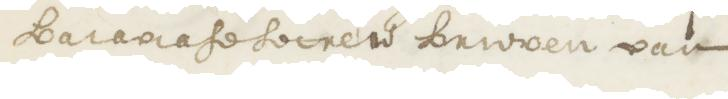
bataviase secrets brieven van
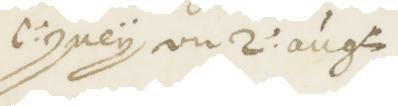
5: julij en 2': augt
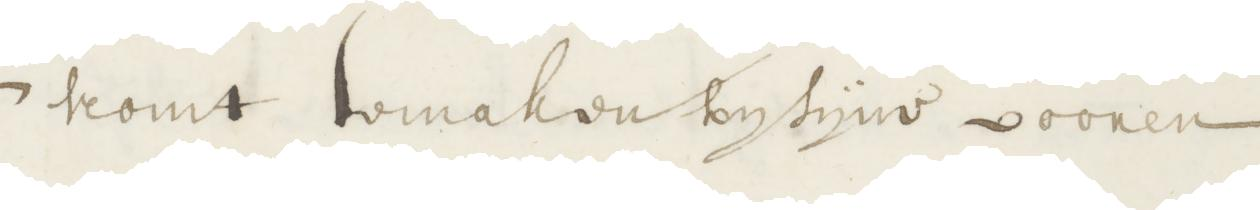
komt temaken bij sijne vooren
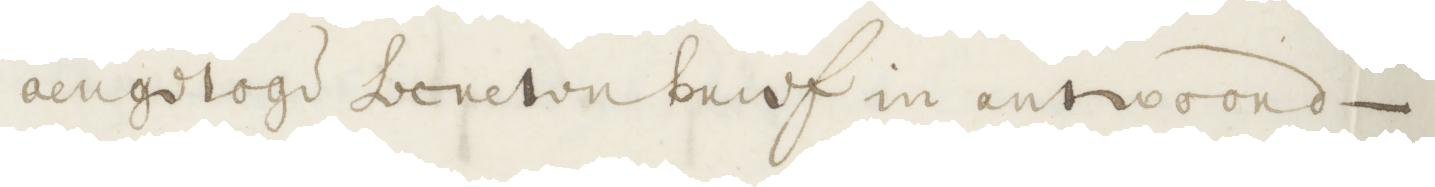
aengetoge secreten brief in antwoord
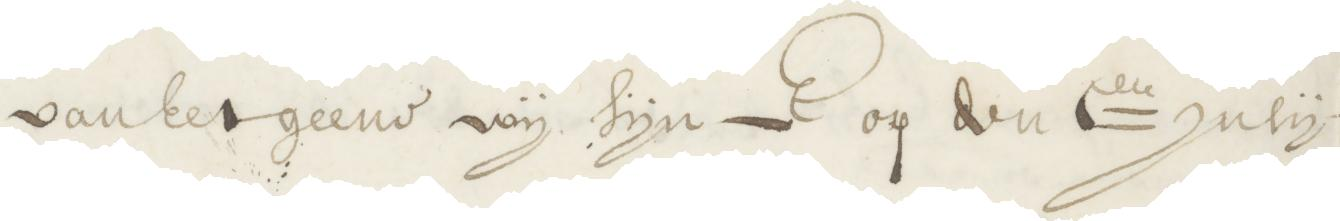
van het geene wij sijn E op den 5=en julij
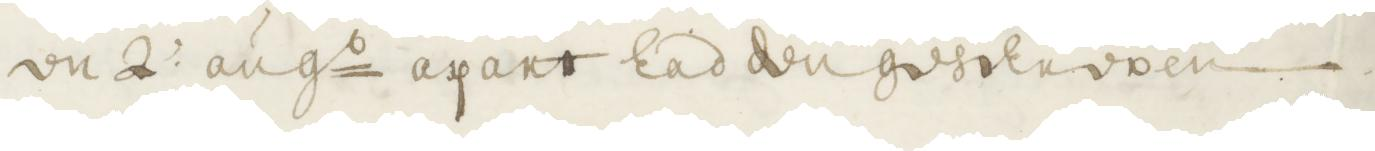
en 2 =en aug=o apart had den geschreven
